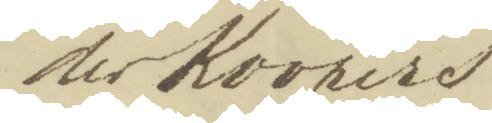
der Koopers
